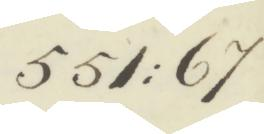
551:67
